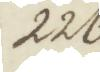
226
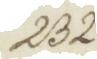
232
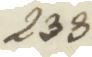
233
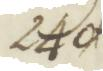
240*
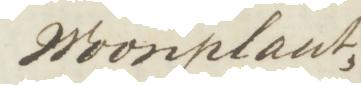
Woonplaat„
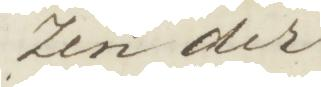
zen der
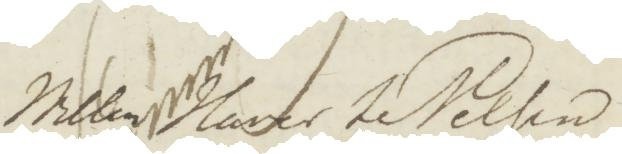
Willen Haver te Velsen
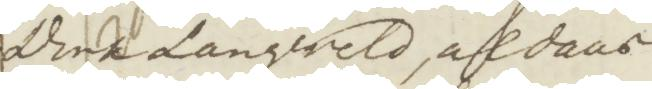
Dirk Langeveld, aldaar
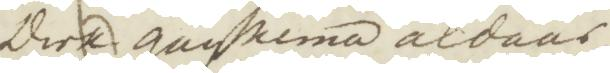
Dirk guykema aldaar
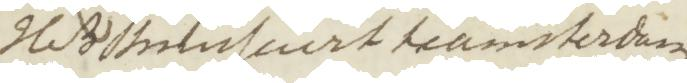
HB Mustart te amsterdam
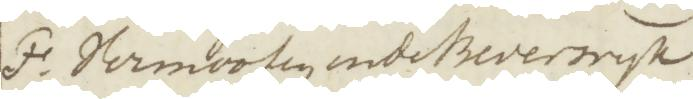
F. Vermooten in de Beverwyk
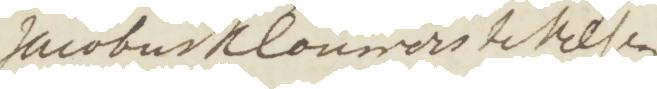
Jacobus Klouwers te Velsen
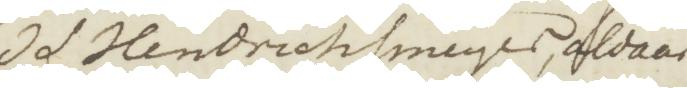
JL Hendrichsmeyer, aldaar
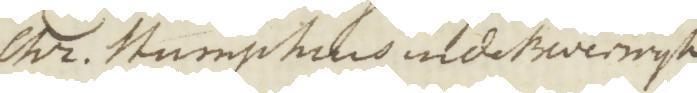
Cr. stumphius in de Beverwyk
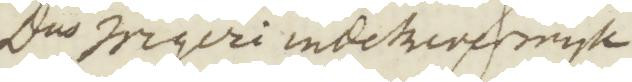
Dns Wigeri in de Beverwyk
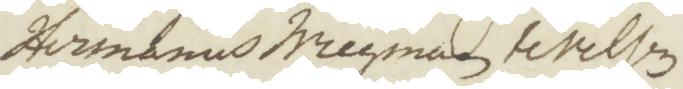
Hermanus Wiegman te Velsen
